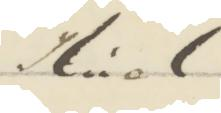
Huet
